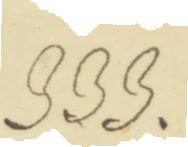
333.
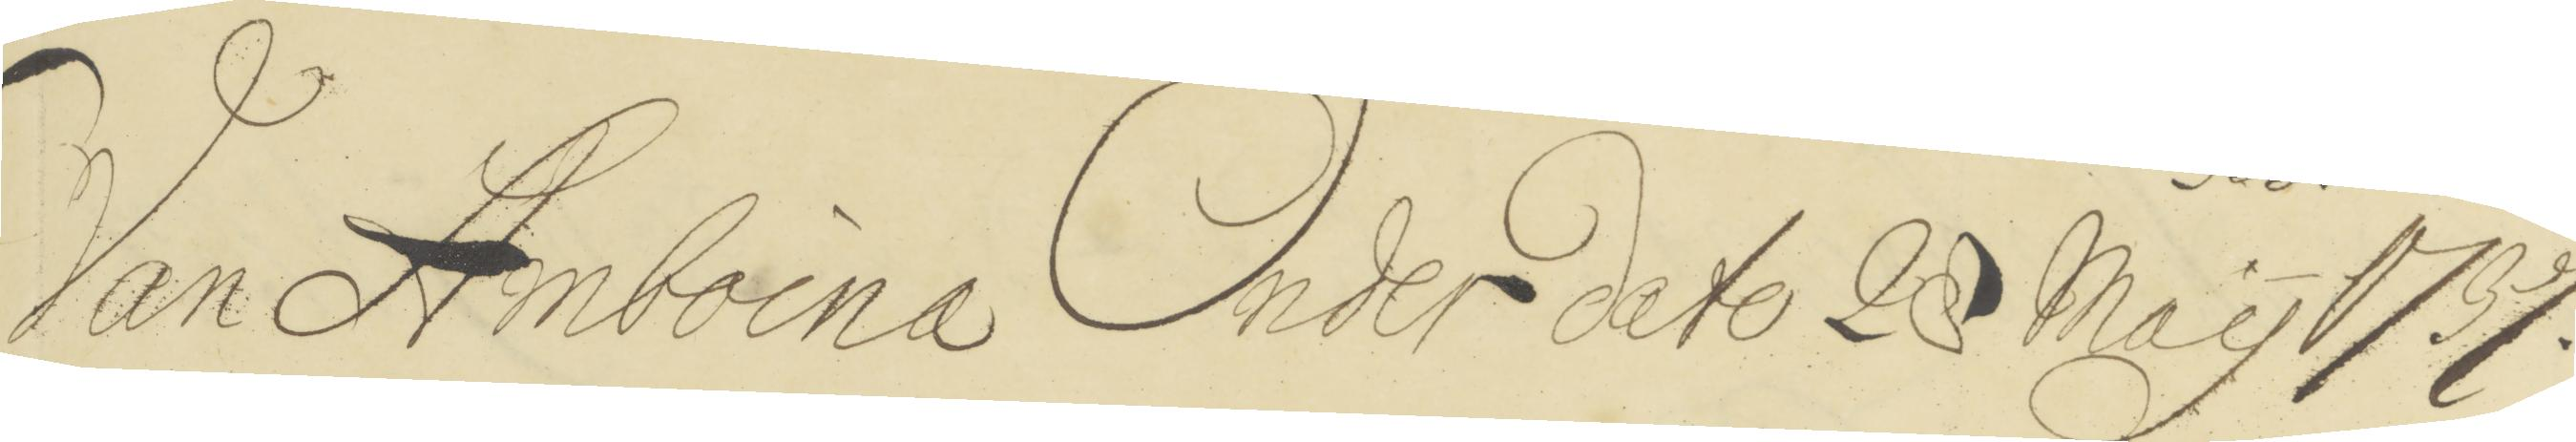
Van Amboina Onder dato 28 Maij 1737.
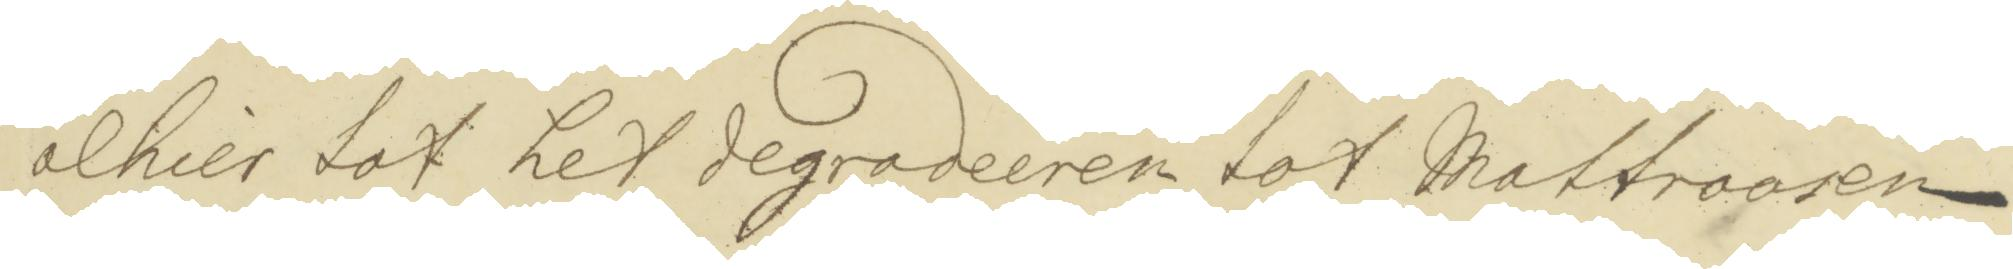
alhier tot het degradeeren tot mattroosen
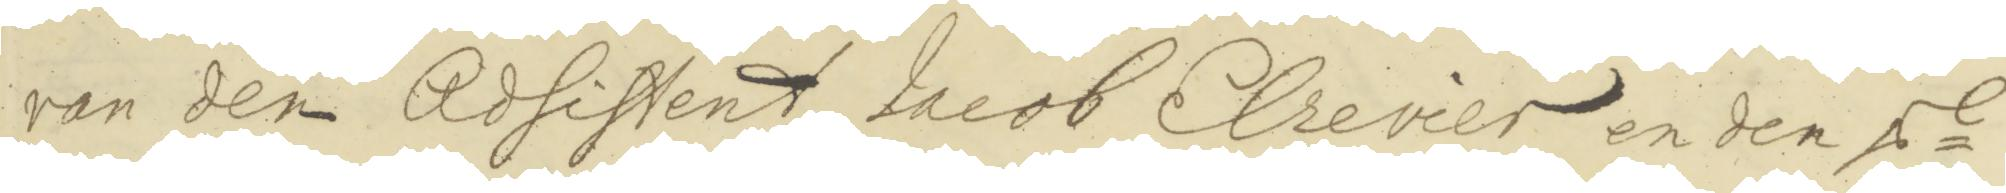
van den Adsistent Iacob Elzevier en den p=l
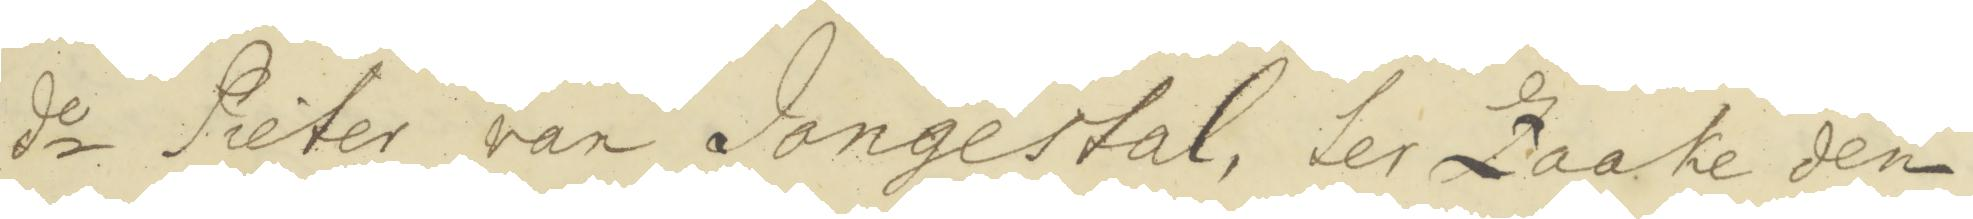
d=e Pieter van Iongestal, ter Zaake den
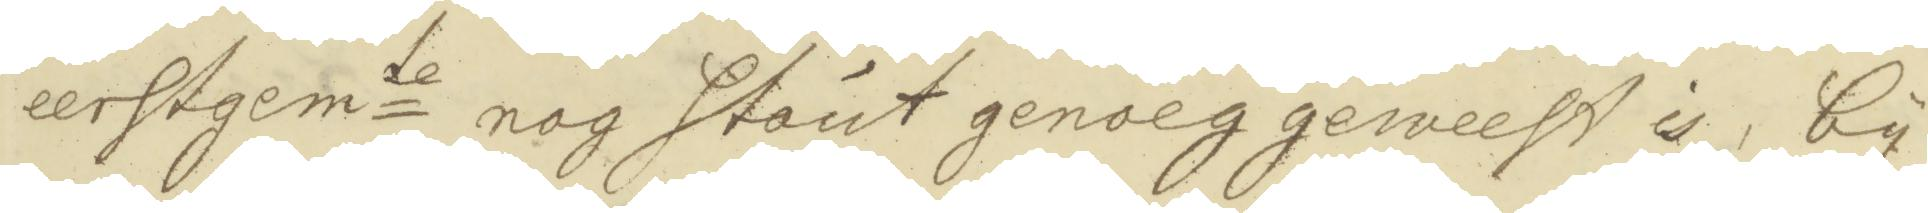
eerstgem=te nog stout genoeg geweest is, bij
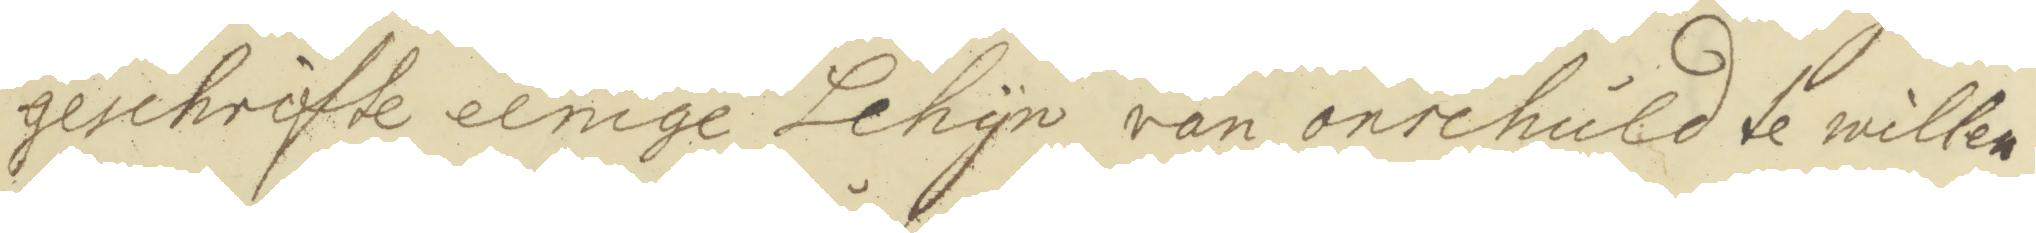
geschrifte eenige schijn van onschuld te willen
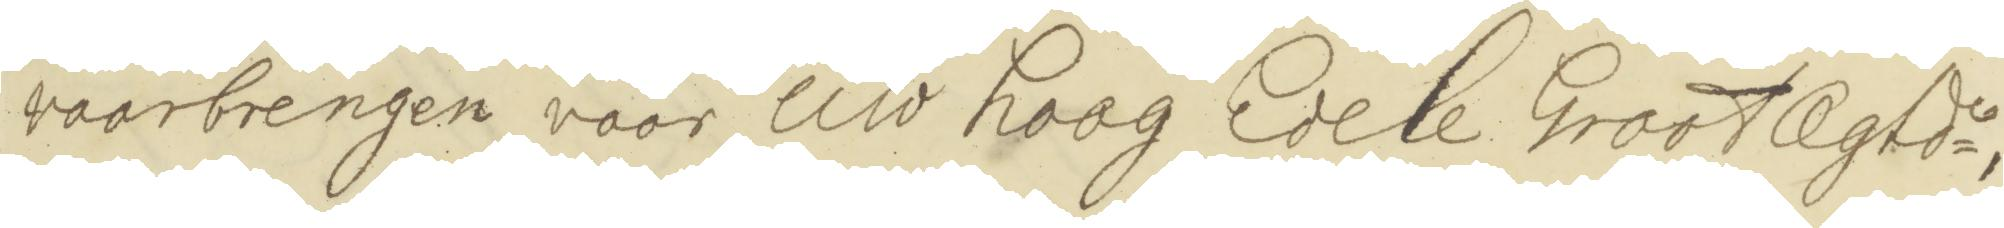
voorbrengen voor UW hoog Edele Groot Agtb=e,
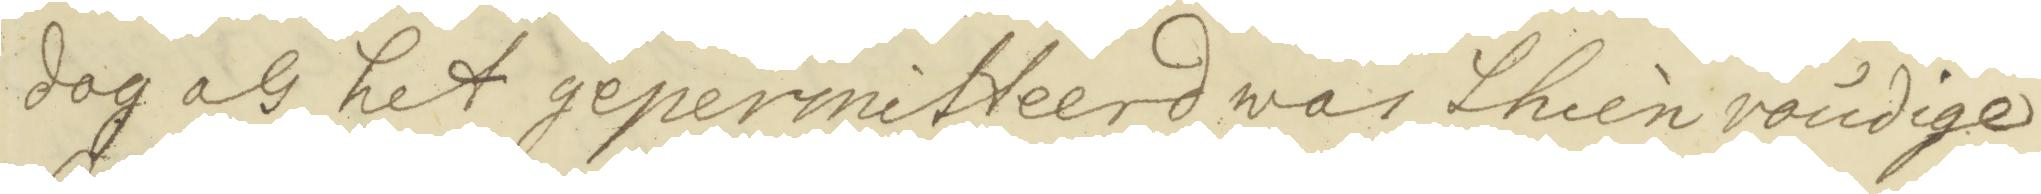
dog als het gepermitteerd was thien voudige
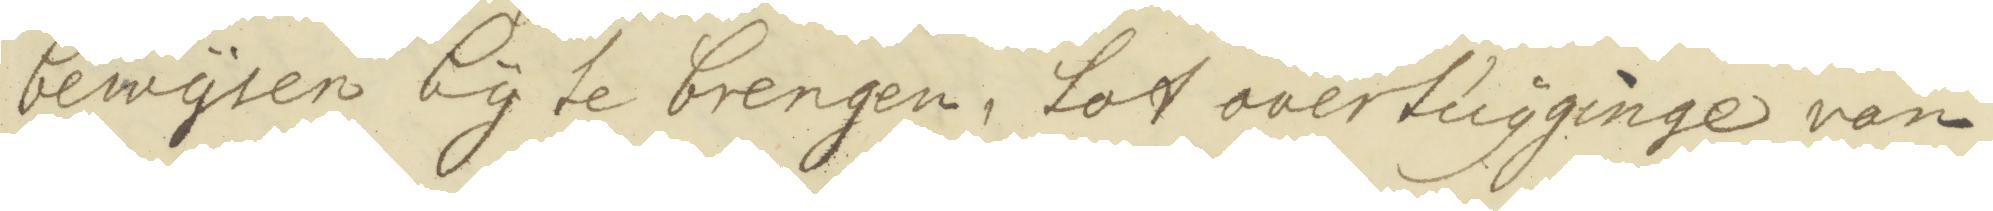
bewijsen bij te brengen, tot overtuijginge van
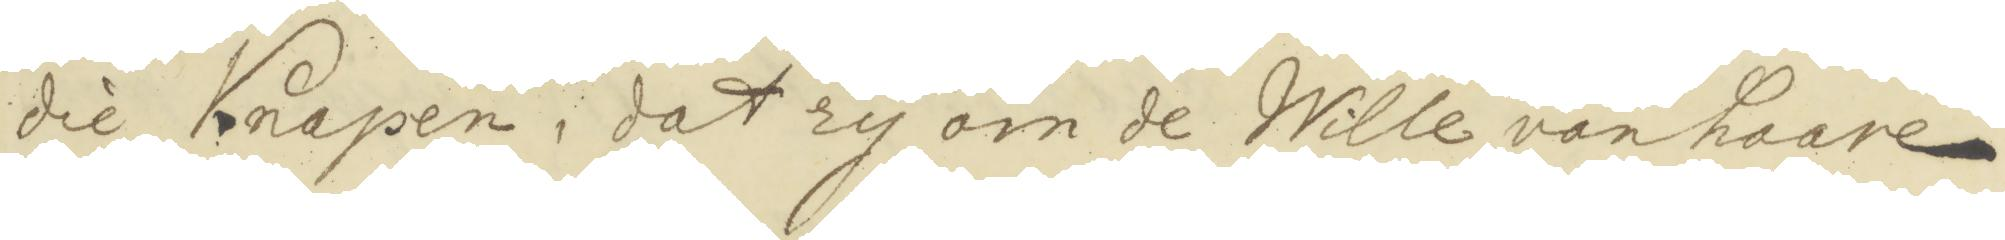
die Knapen, dat zij om de Wille van haare
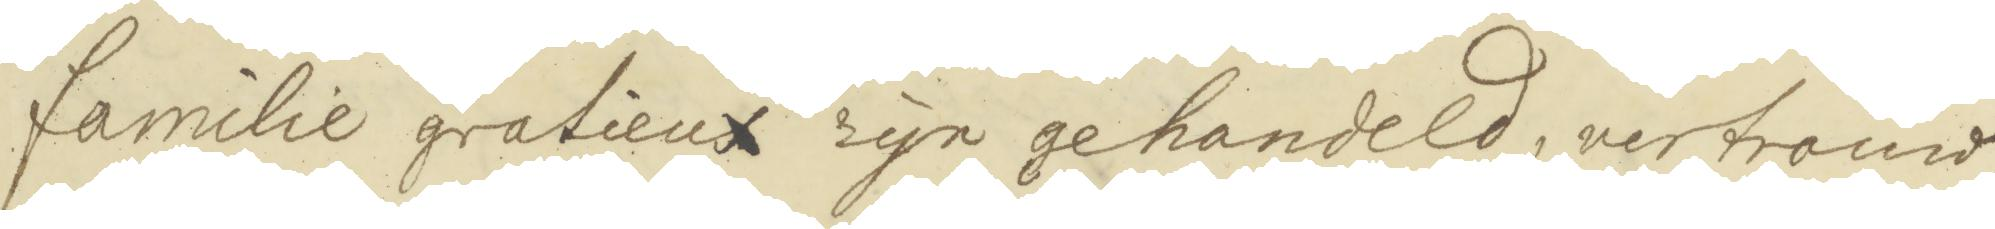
familie gratieux zijn gehandeld, vertrouw
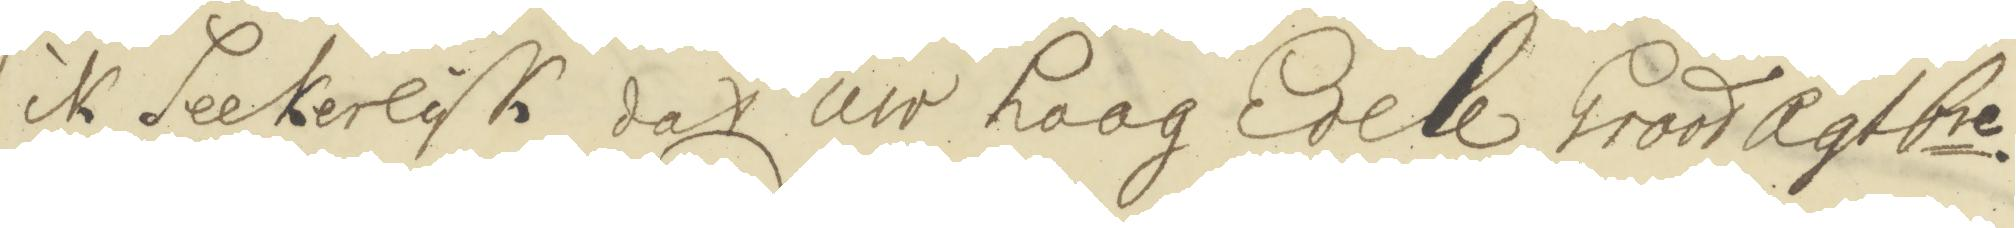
ik seekerlijk dat uw hoog Edele Groot Agtb=re
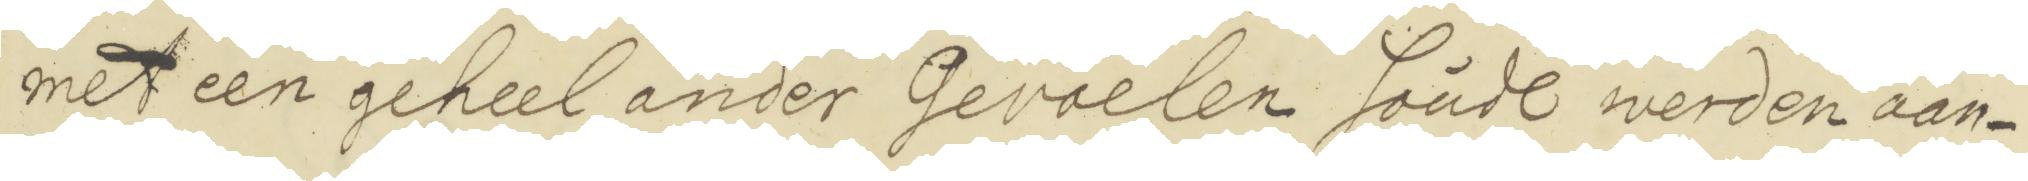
met een geheel ander gevoelen soude werden aan-
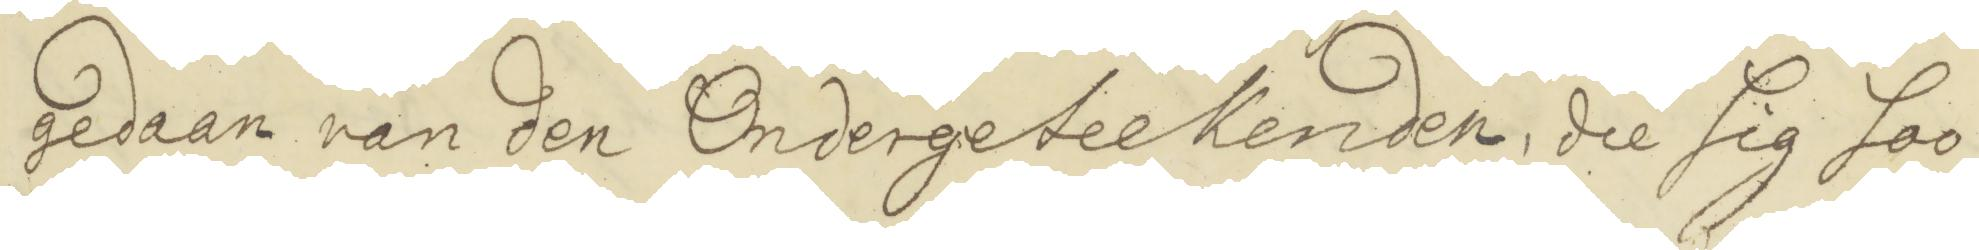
gedaan van den Ondergeteekenden, die sig soo
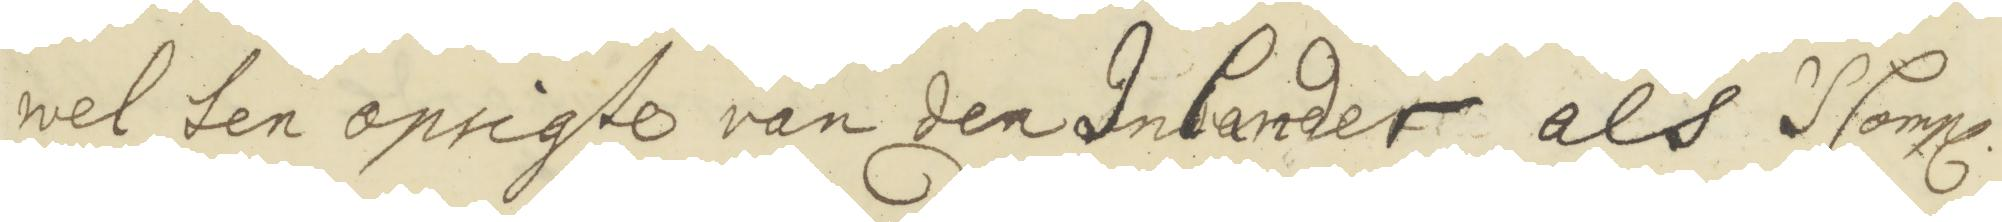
wel ten opsigte van den Inlander als ’s Comp.
